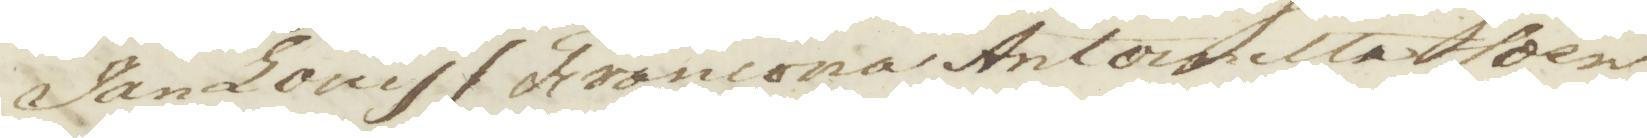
Jan Louis / Francina Antoinetta Coen
